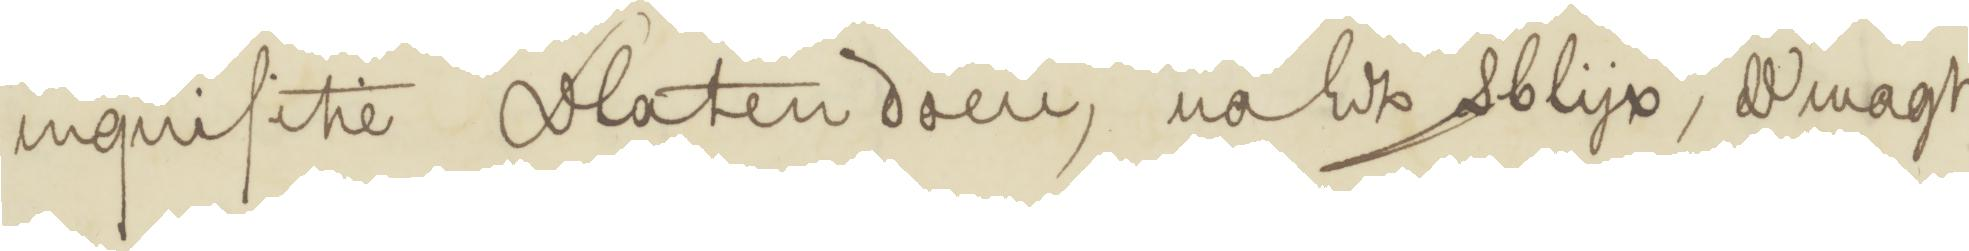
inquisitie telaten doen, na het verblijv, de magt
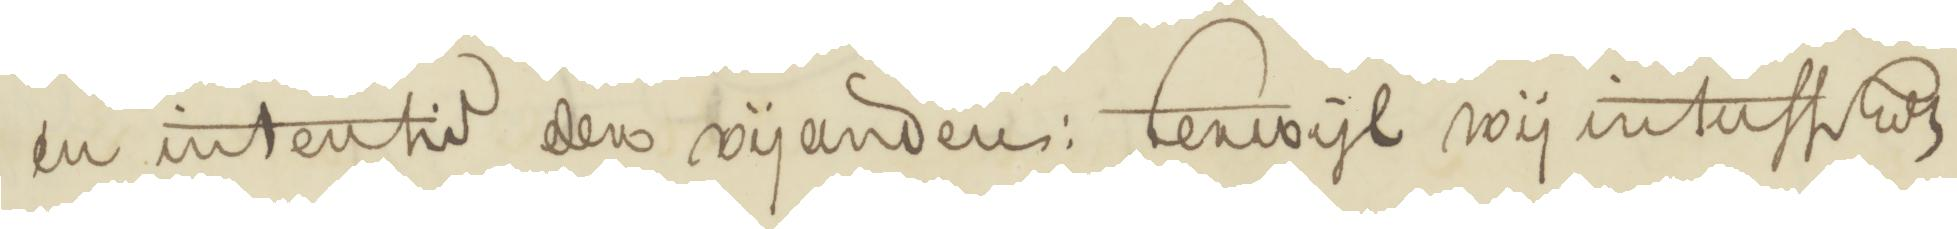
en intentie der vijanden: terwijl wij intusschen
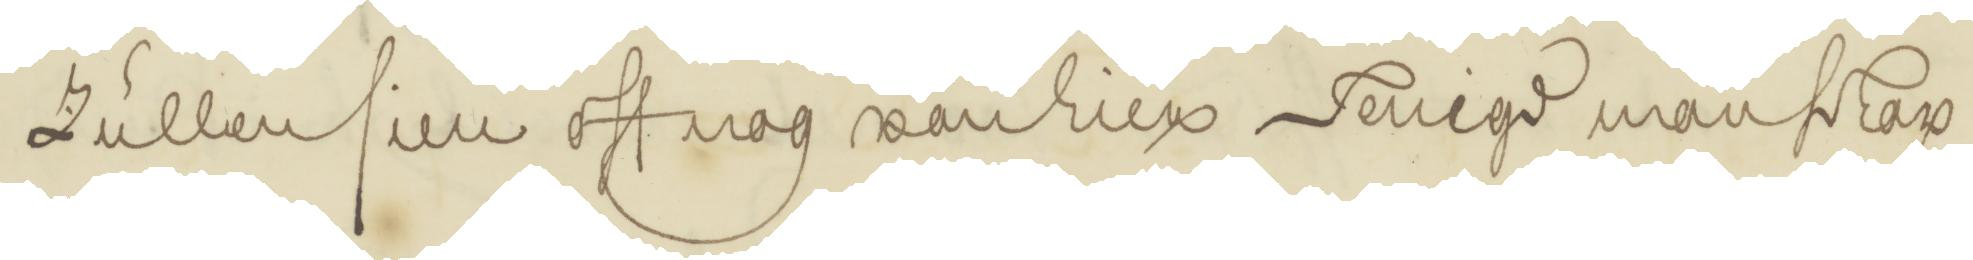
zullen sien off nog van hier Eenige manschap
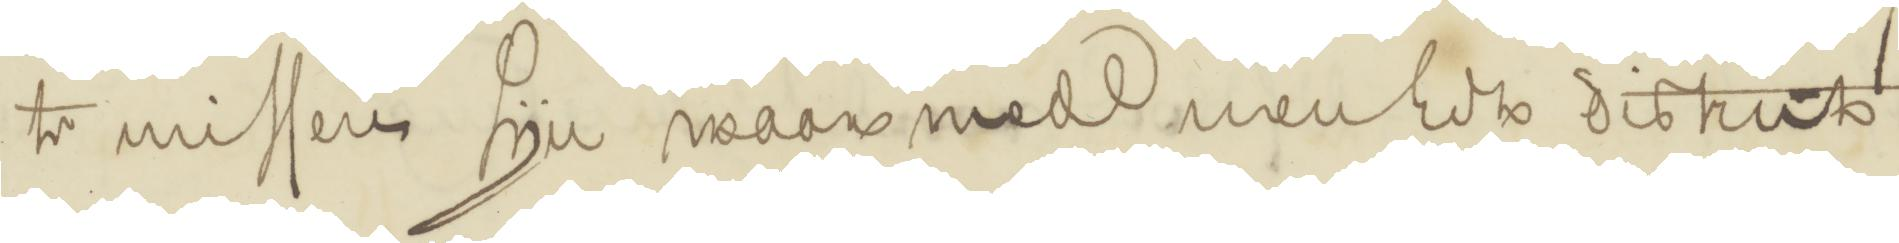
te missen sijn waar mede men het district
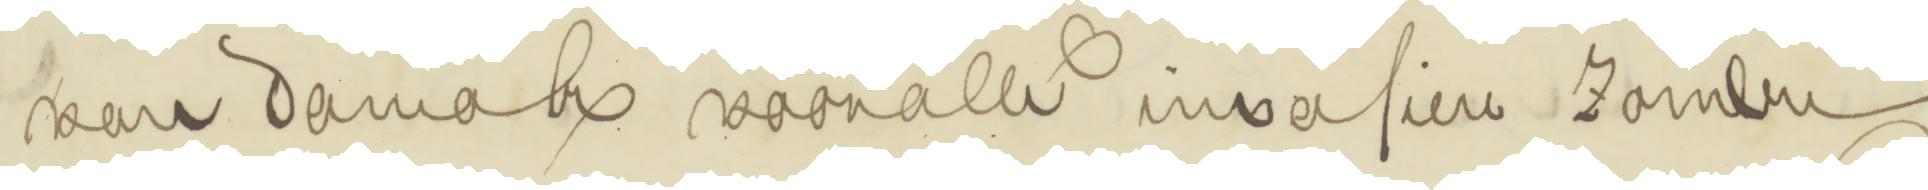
van damak vooralle invasien zouden
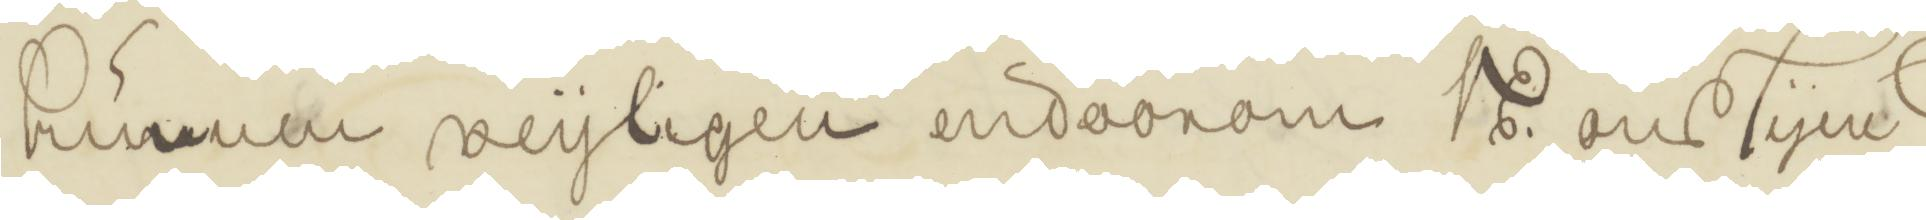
kunnen veijligen endoorom VE: ons sijne
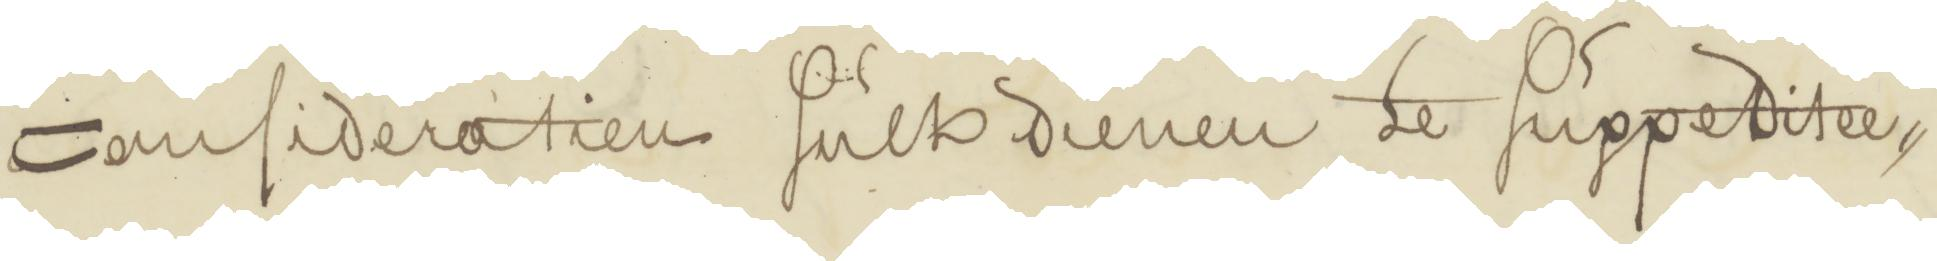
consideratien sult dienen te suppeditee„
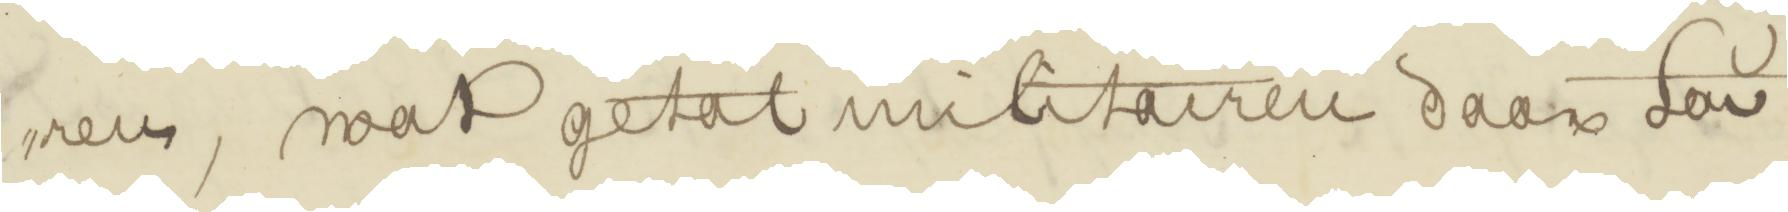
„ren, wat getal militairen daar toe
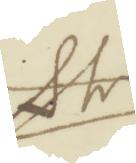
vertr
